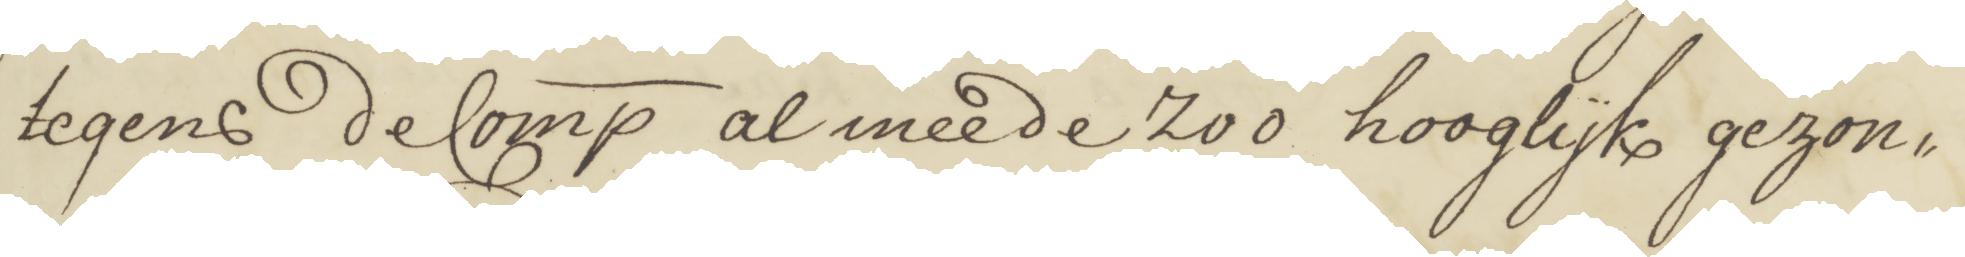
tegens de Comp al meede zoo hooglijk gezon„
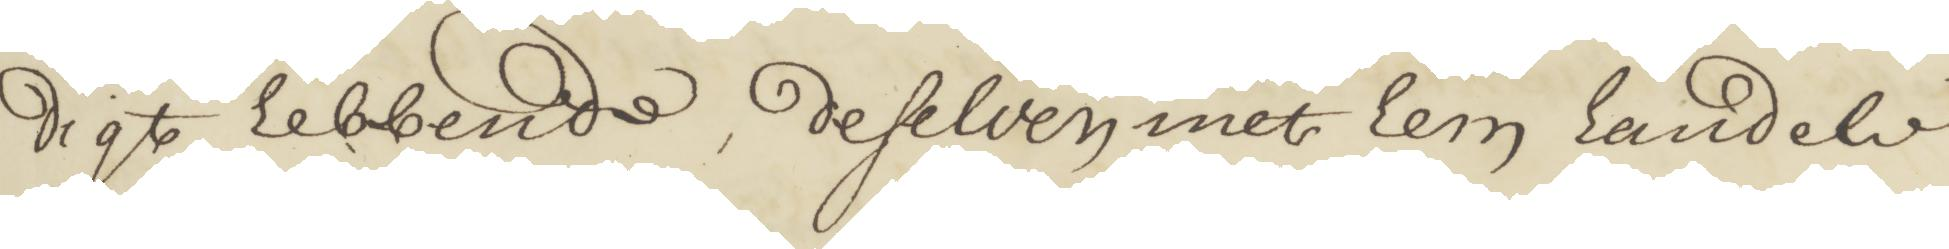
digt hebbende, deselven met hem handele
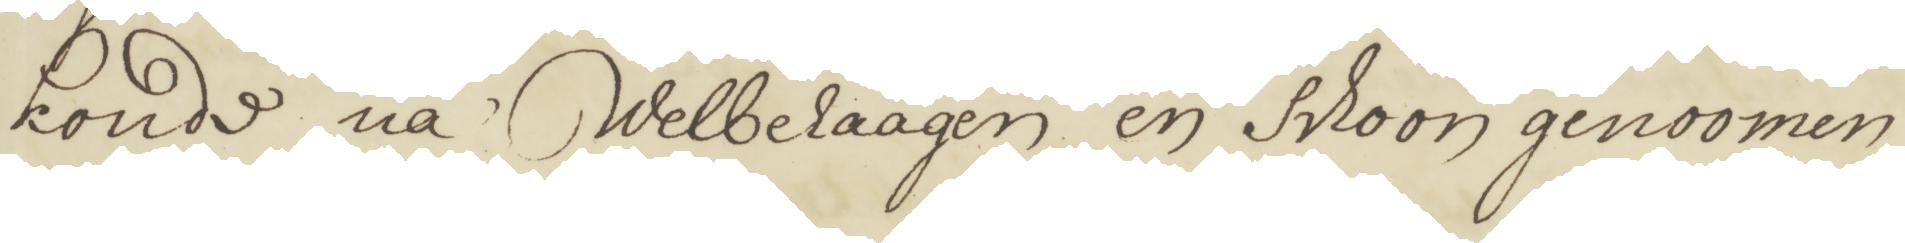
konde na welbehaagen en schoon genoomen
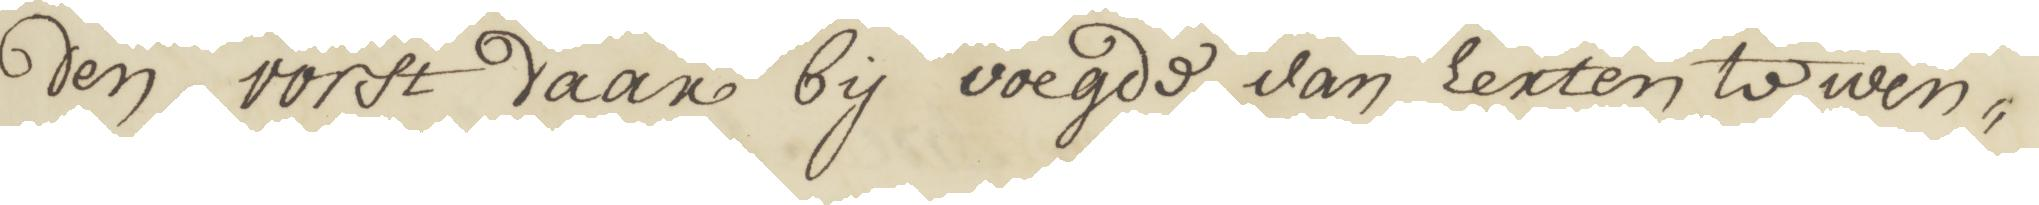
den vorst daar bij voegde van herten te wen„
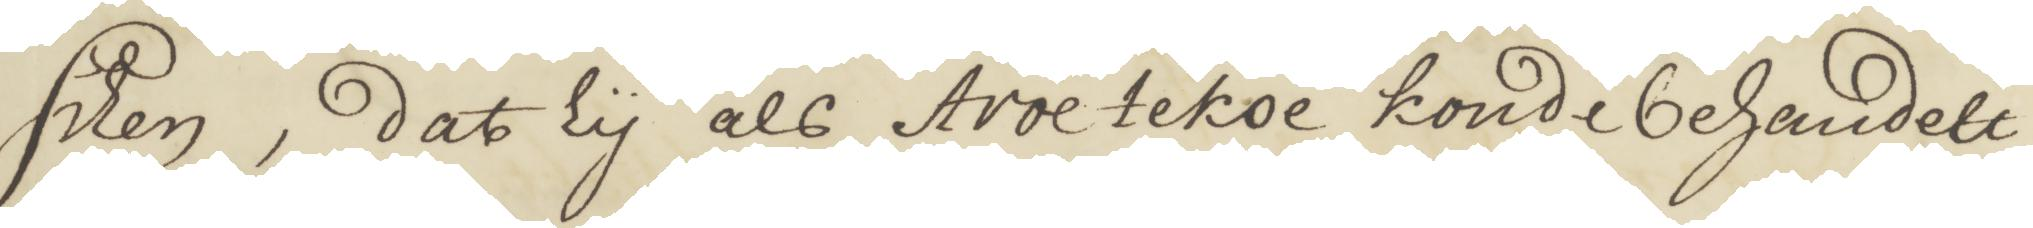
schen, dat hij als Aroetekoe konde behandelt
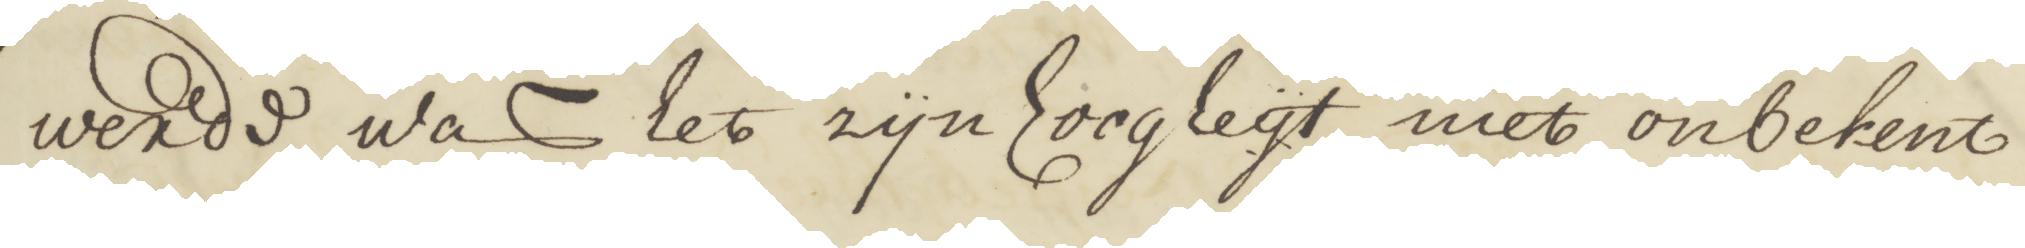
werde was het zijn hoogheijt niet onbekent
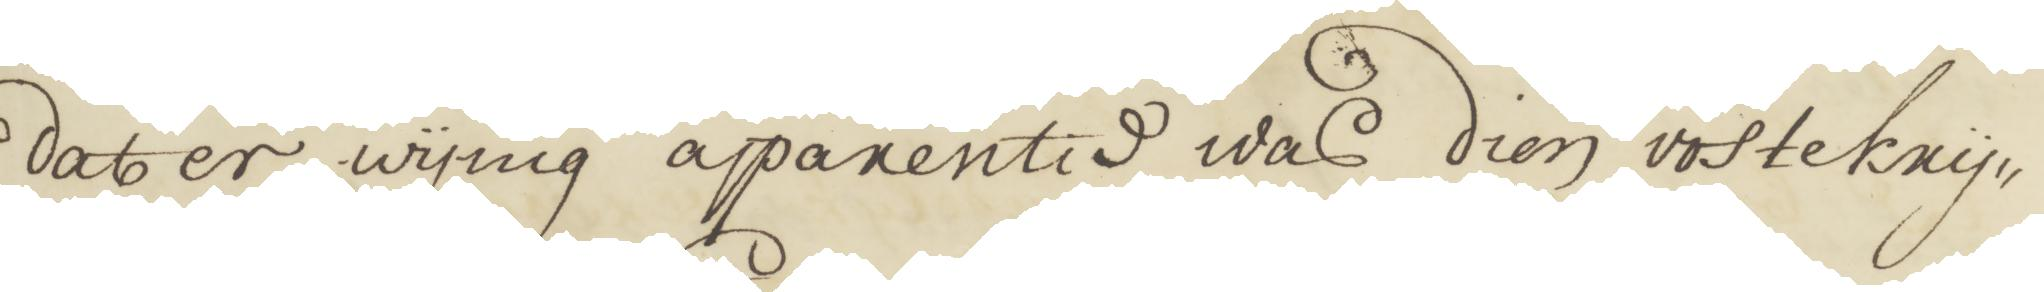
dat er wijnig apparentie was dien vos tekrij„
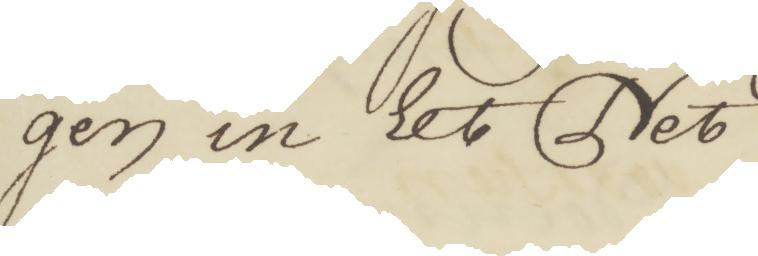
gen in het Net
